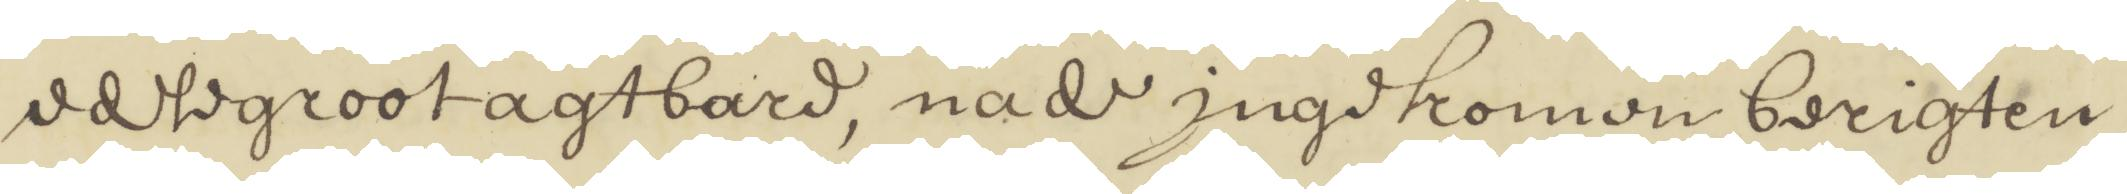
edele groot agtbare, na de jngekomen berigten
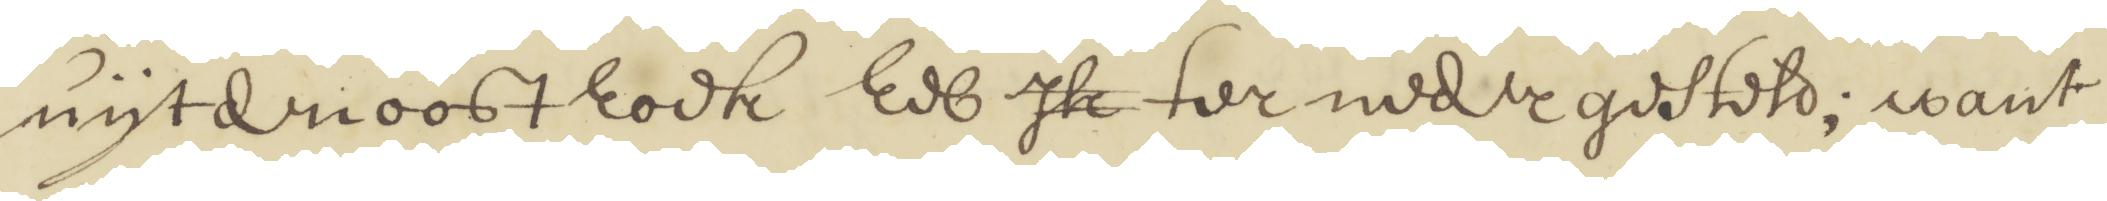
uijt den oosthoek heb Jk ter neder gesteld; want
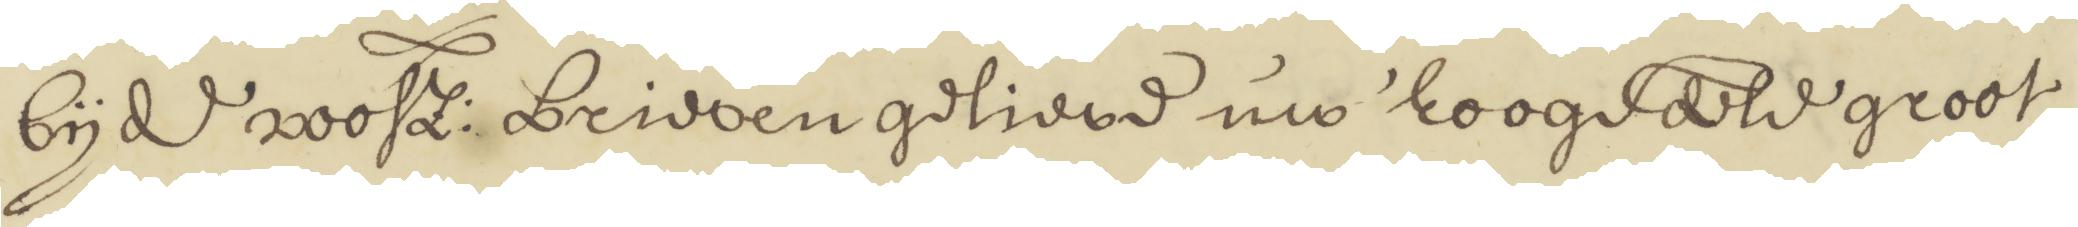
bij de voosz: brieven gelieve uw 'hoog Edele groot
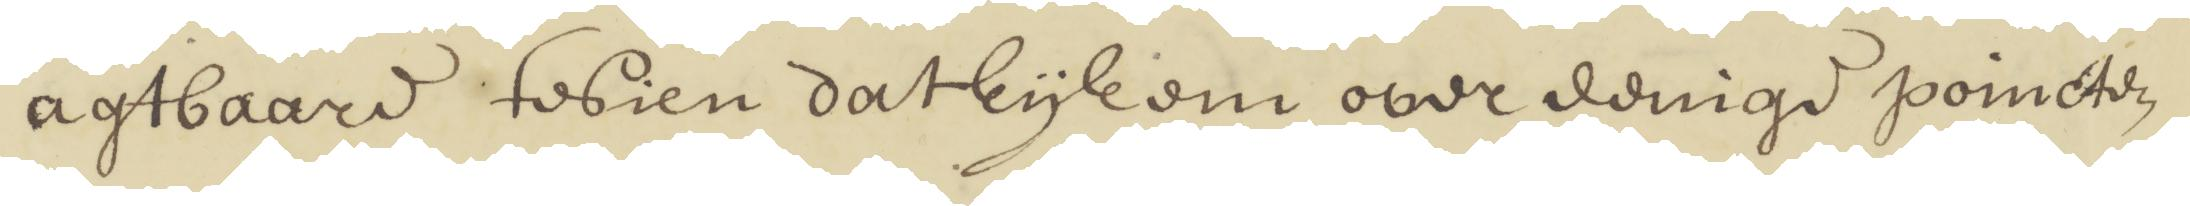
agtbaare tesien dat hij hem over eenige poincten
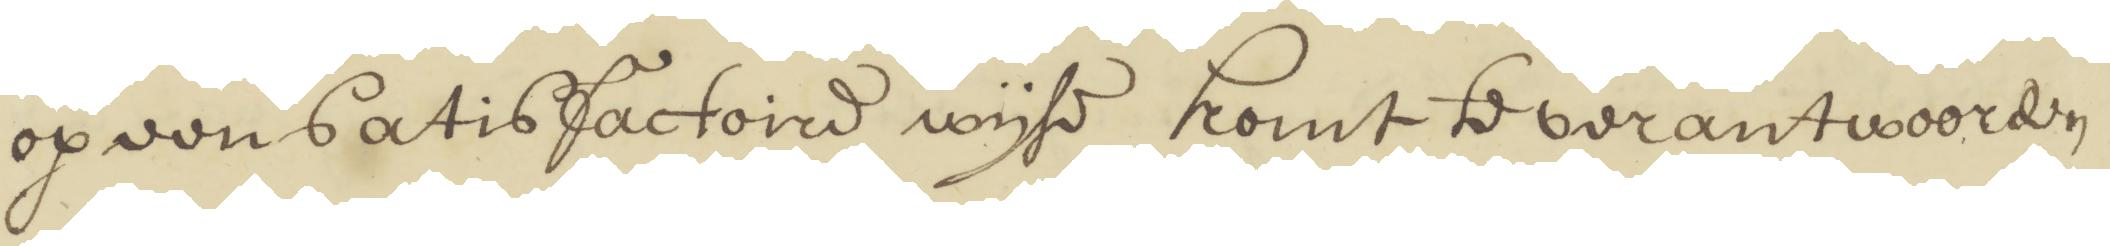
op een satisfactoire wijse komt te verantwoorden
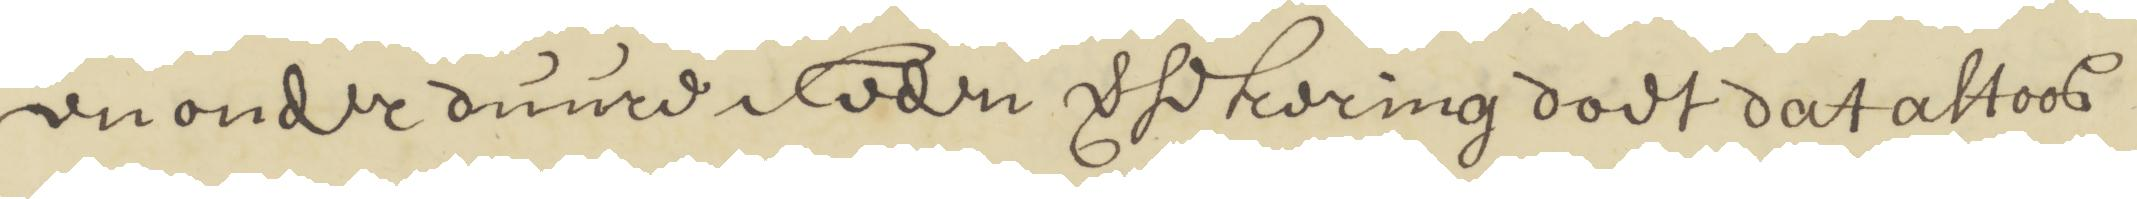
en onder duure Eeden versekering doet dat altoos
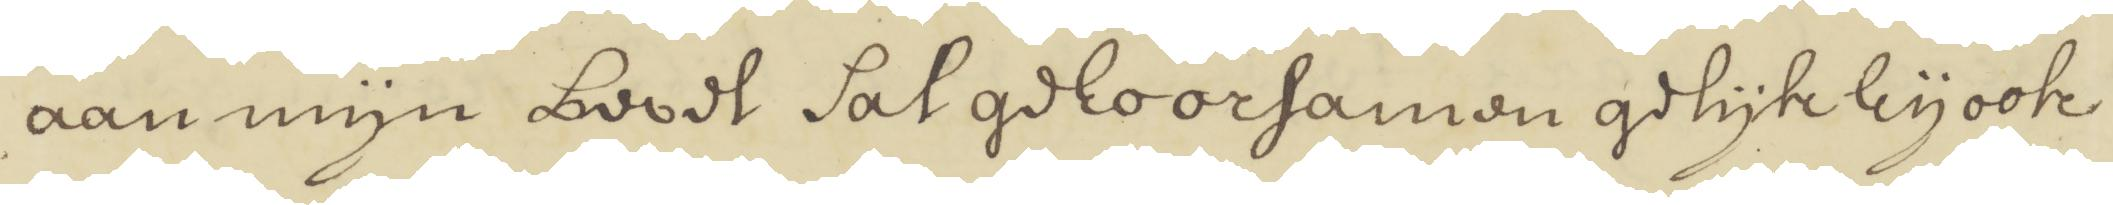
aan mijn bevel sal gehoorsamen gelijk hij ook
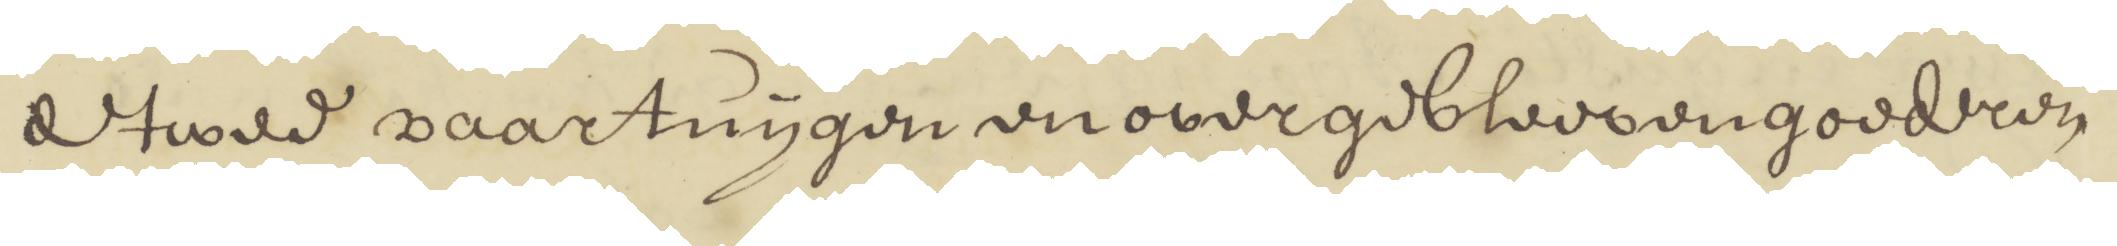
de twee vaartuijgen en overgebleeven goederen
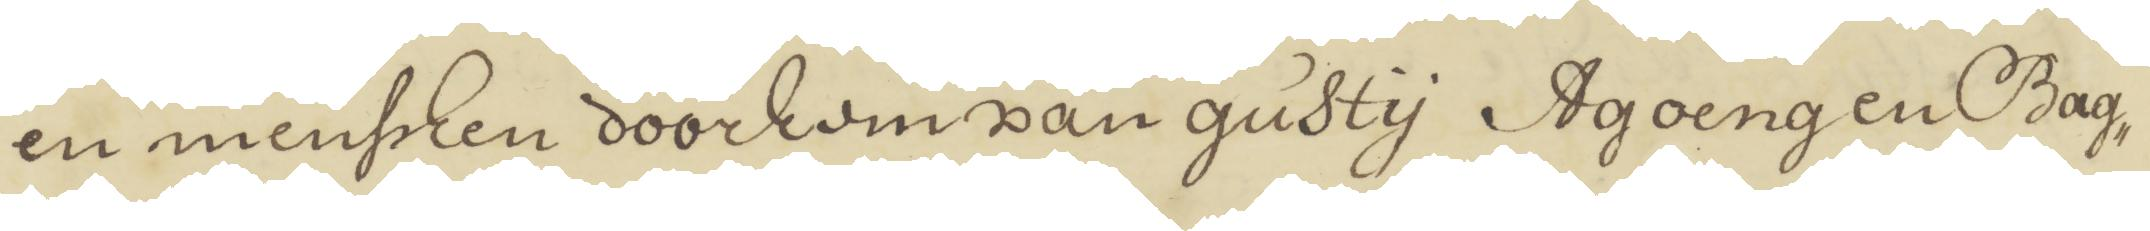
en menschen door hem van gustij Agoeng en Bag„
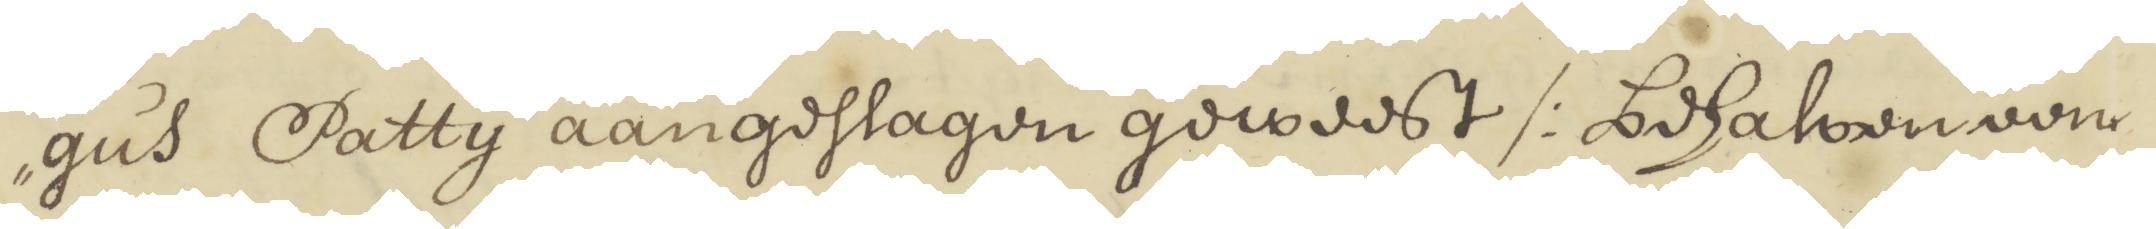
„gus Pattij aangeslagen geweest /:behalven een
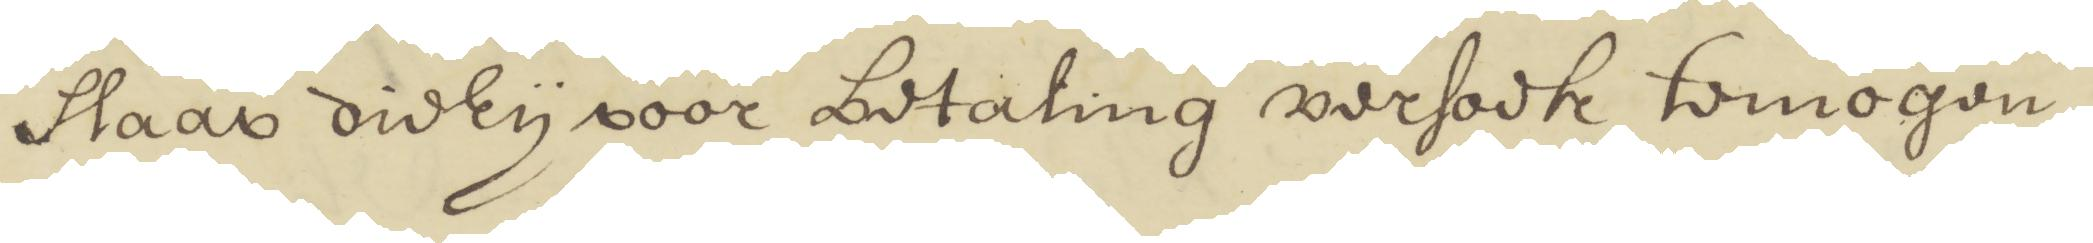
slaav die hij voor betaling versoek temogen
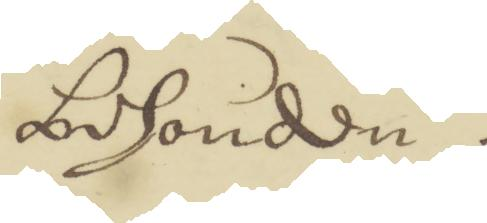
behouden
